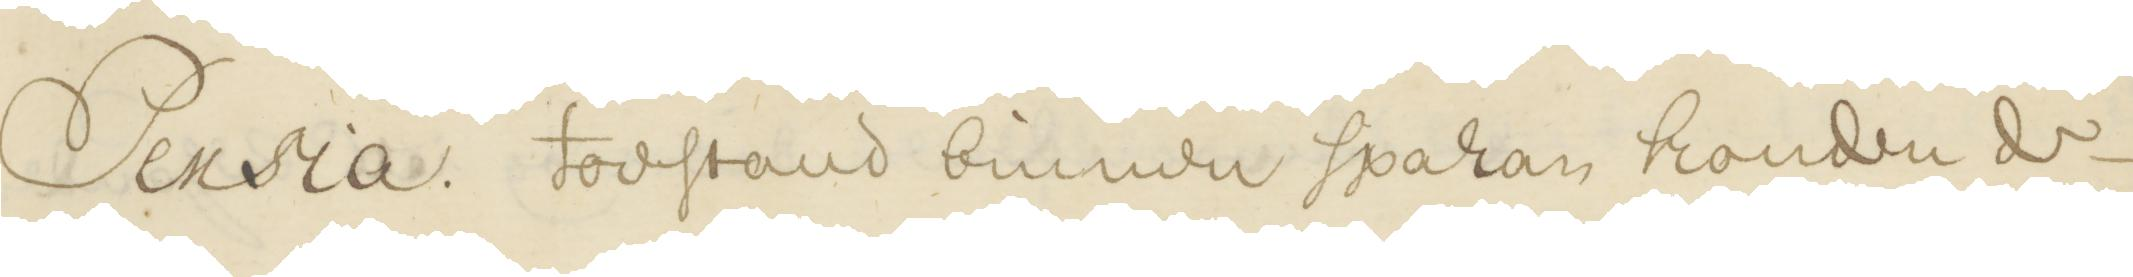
Persia. toestand binnen spahan konden de
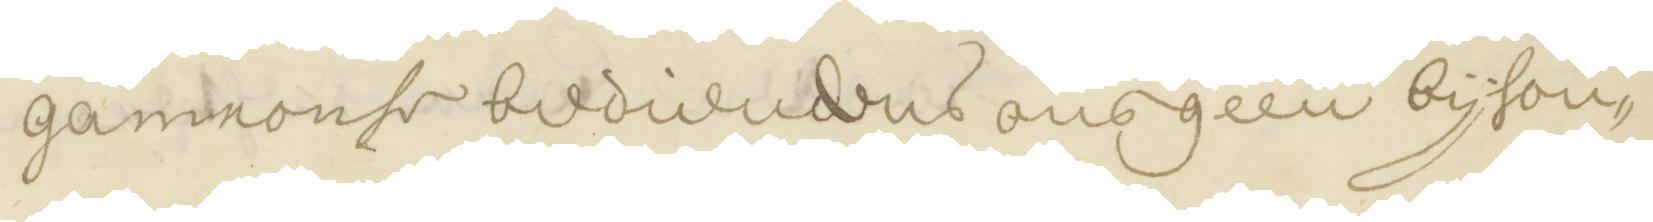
gamronse bediendens ons geen bijson„
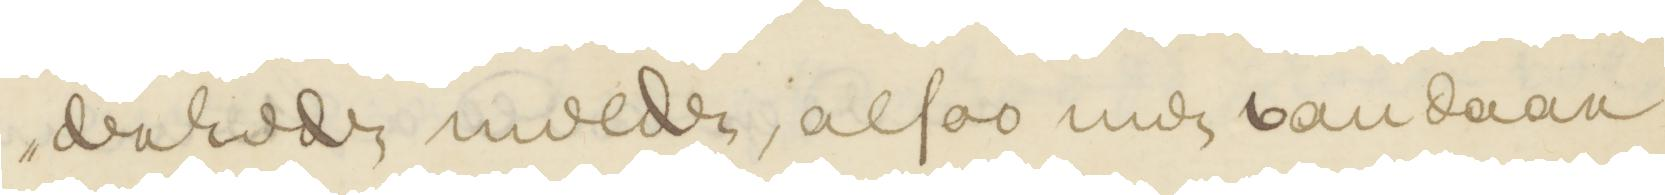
„derheden melden, alsoo men van daar
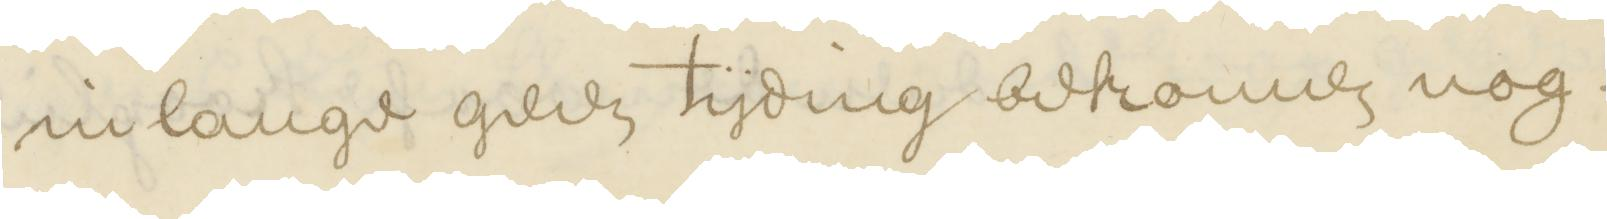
in lange geen tijding bekomen nog
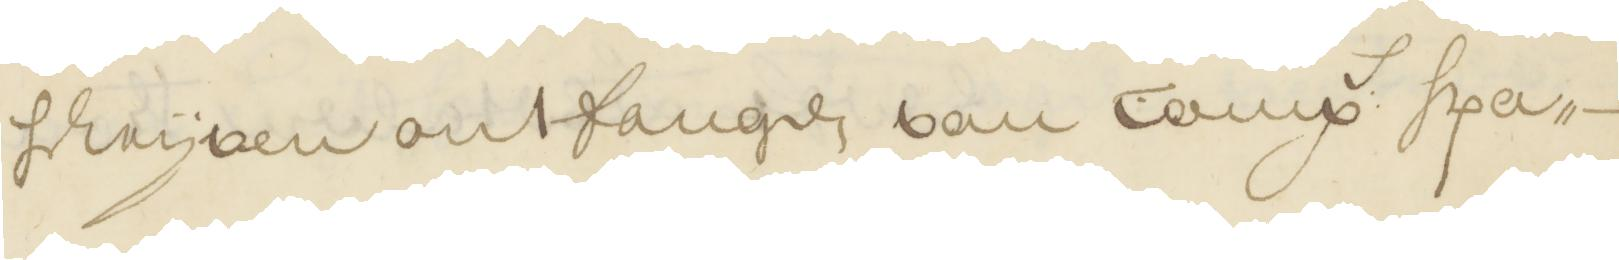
schrijven ontfangen van Comp:s spa„
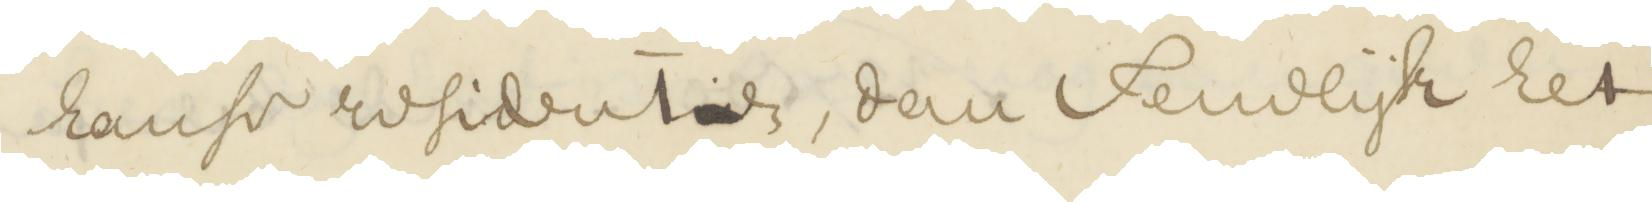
hanse residentie, dan Eenelijk het
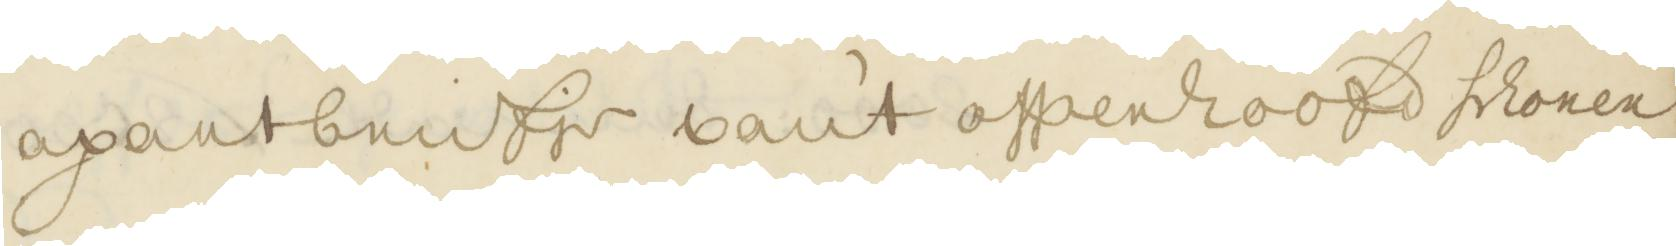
apart briefje van't opperhoofd schoner
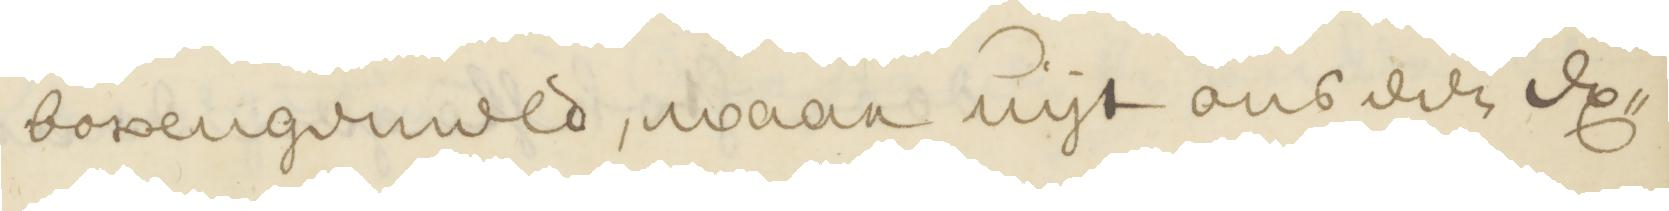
bovengemeld, waar uijt ons een ex„
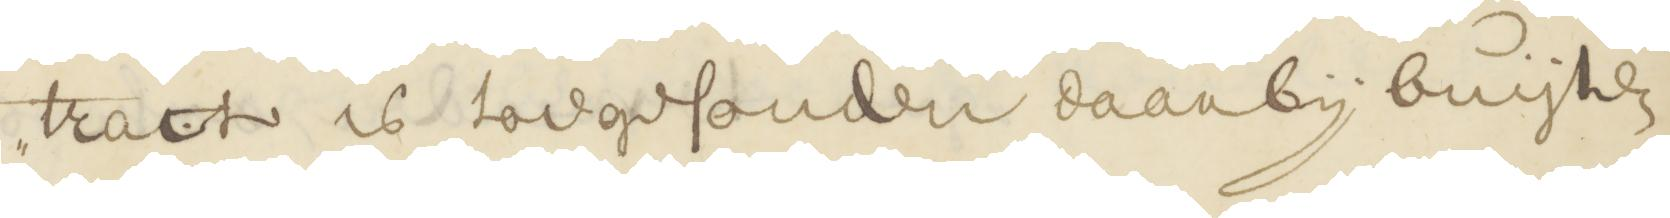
„tract is toegesonden daar bij buijten
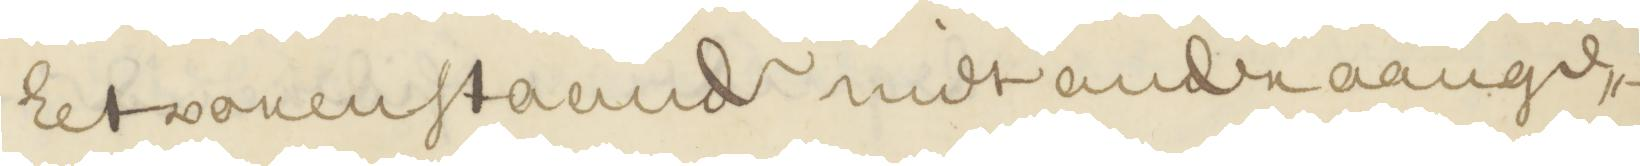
het vorenstaande niet ander aange„
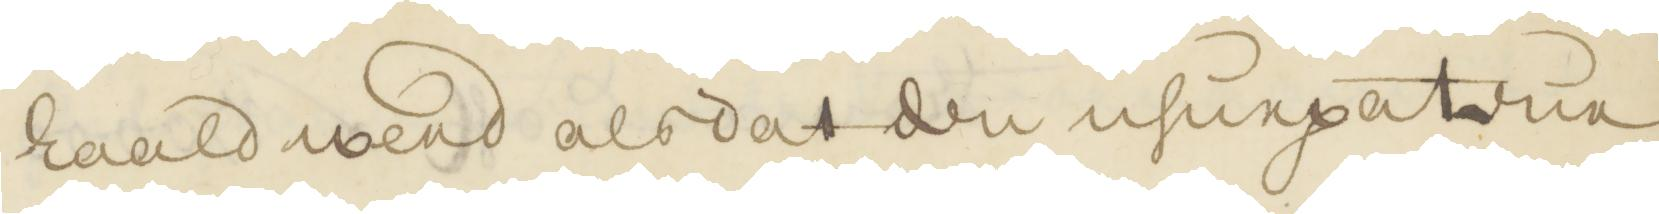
haald werd als dat den usurpateur
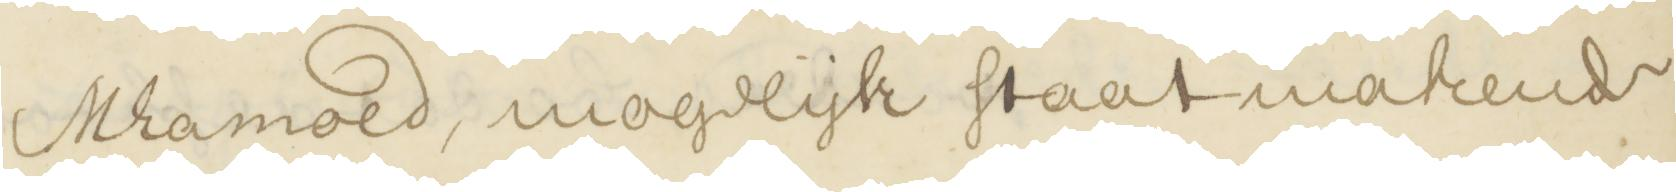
Mhamoed, mogelijk staat makende
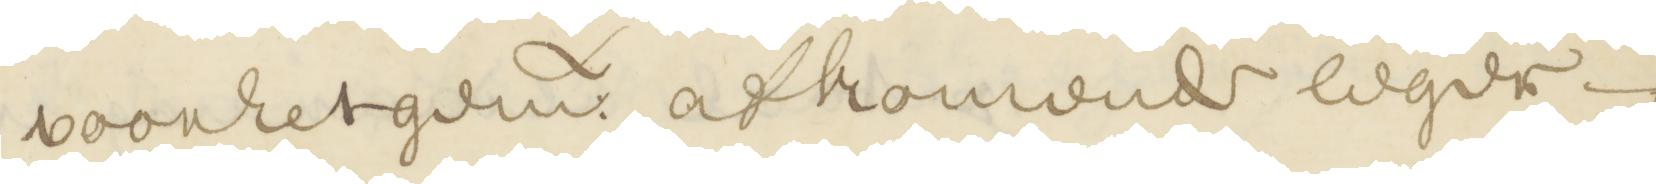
voor het gem: afkomende leger
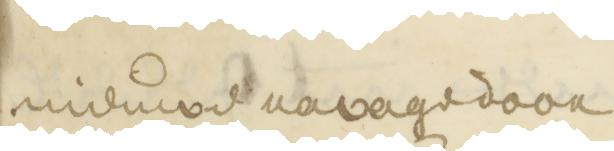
nieuwe ravage door
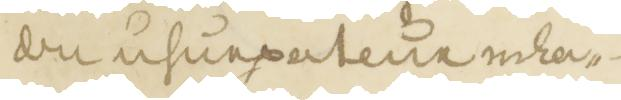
den usurpateur mha„
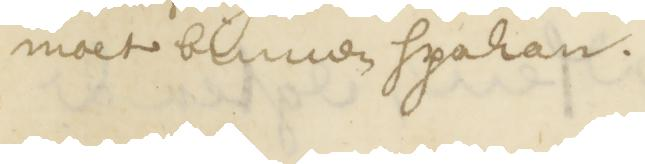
moet binnen spahan.
